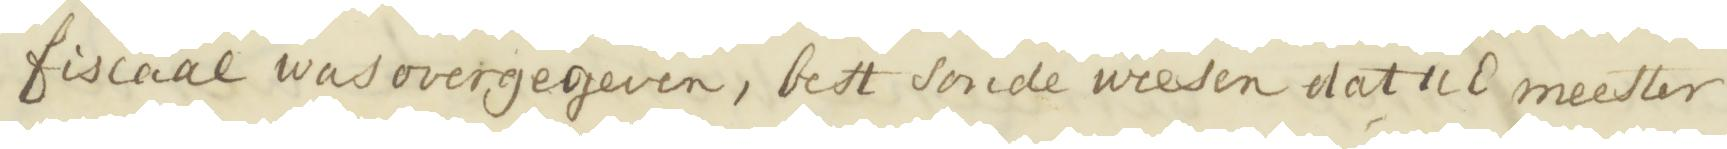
fiscaal was overgegeven, best soude weesen dat uE meester
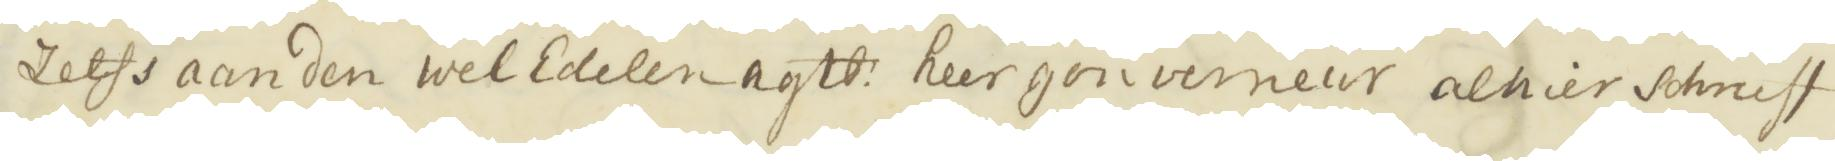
zelfs aan den wel Edelen agtb: heer gouverneur alhier schreeff
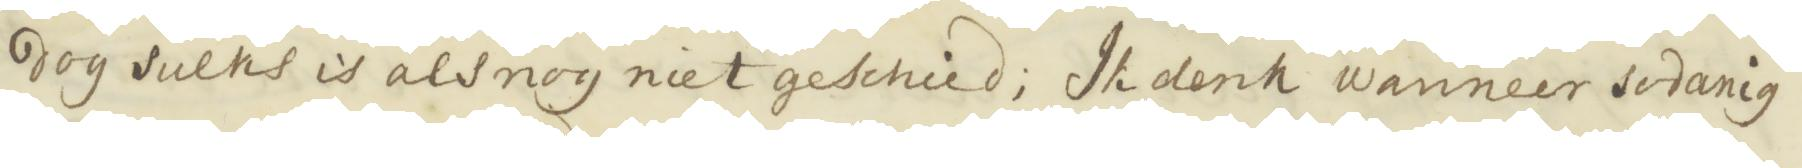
dog sulks is als nog niet geschied; Ik denk wanneer sodanig
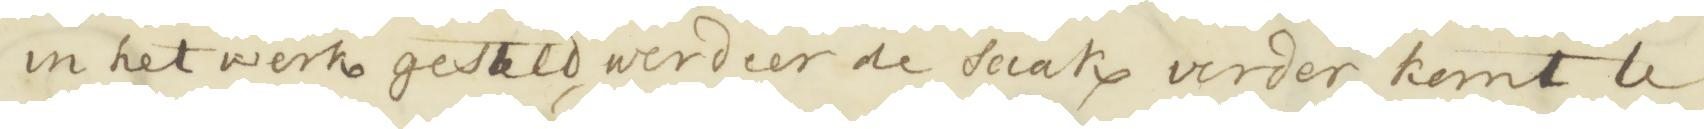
in het werk gesteld werd eer de saak verder komt te
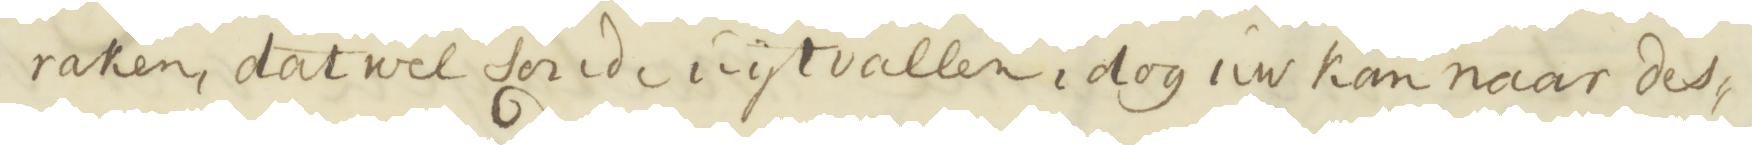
raken, dat wel soude uijtvallen, dog uw kan naar des„
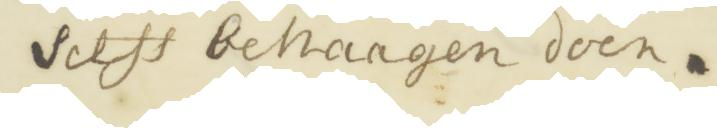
selfs behaagen doen.
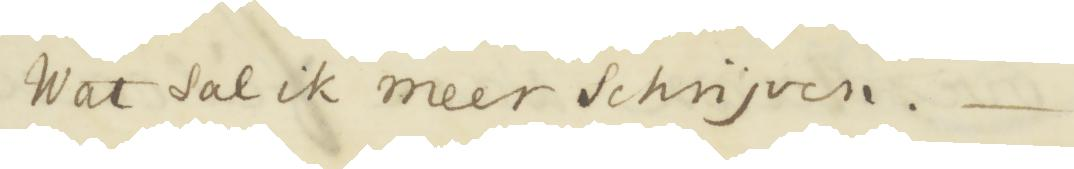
Wat sal ik meer schrijven. —
